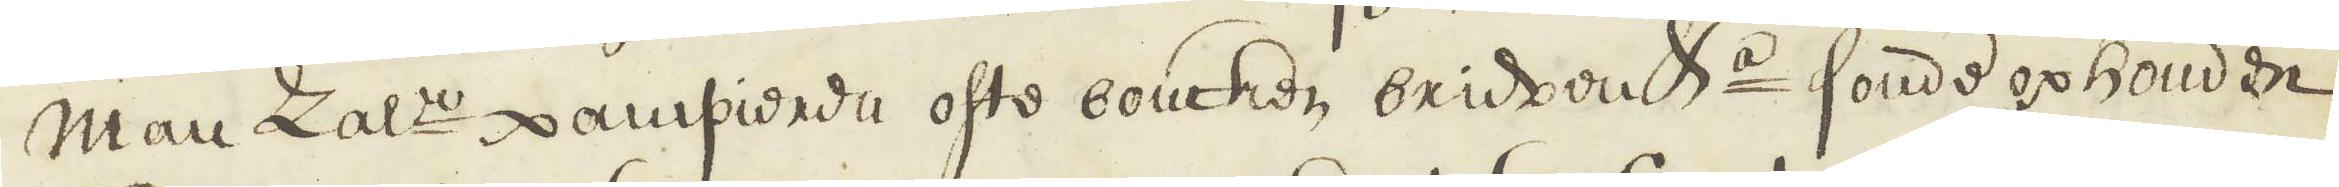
man zal=r pampieren ofte boucken brieven &=a soude ophouden
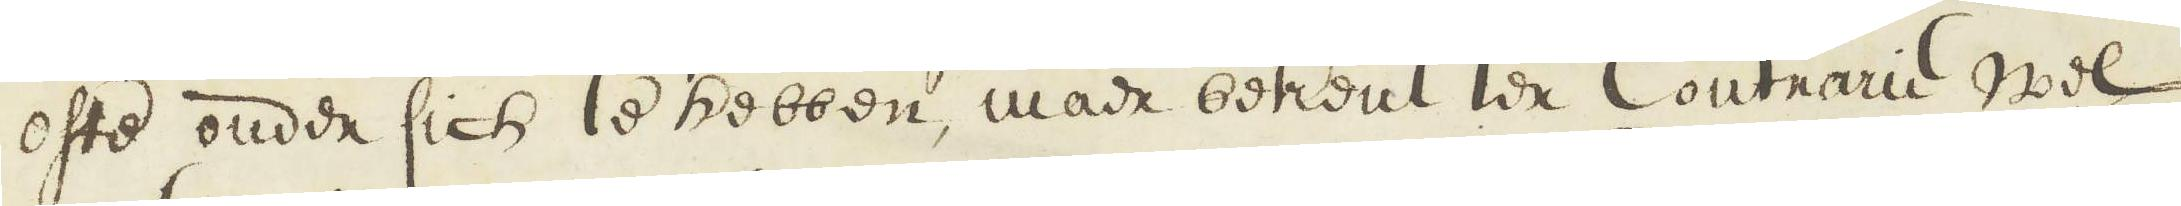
ofte onder sich te hebben, maer bekent ter Contrarie wel
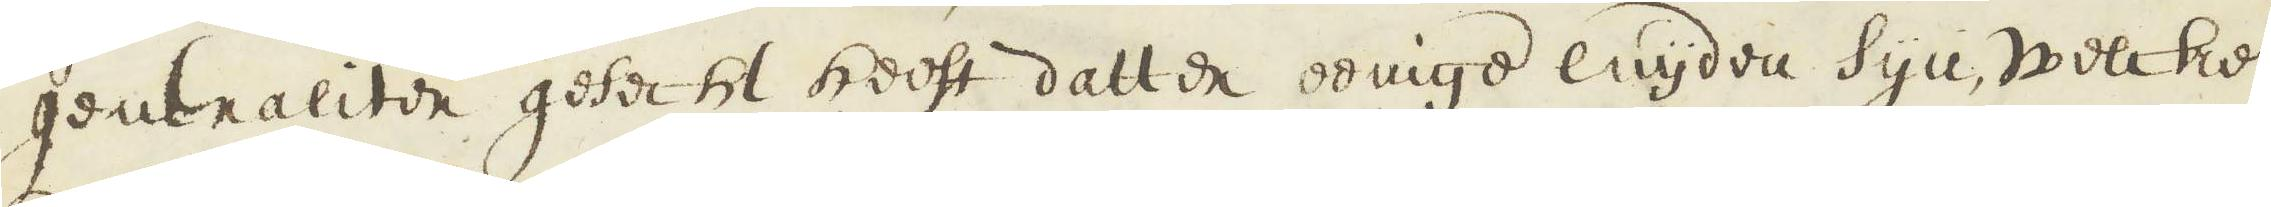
generaliter gesecht heeft datter eenige luijden sijn, welcke
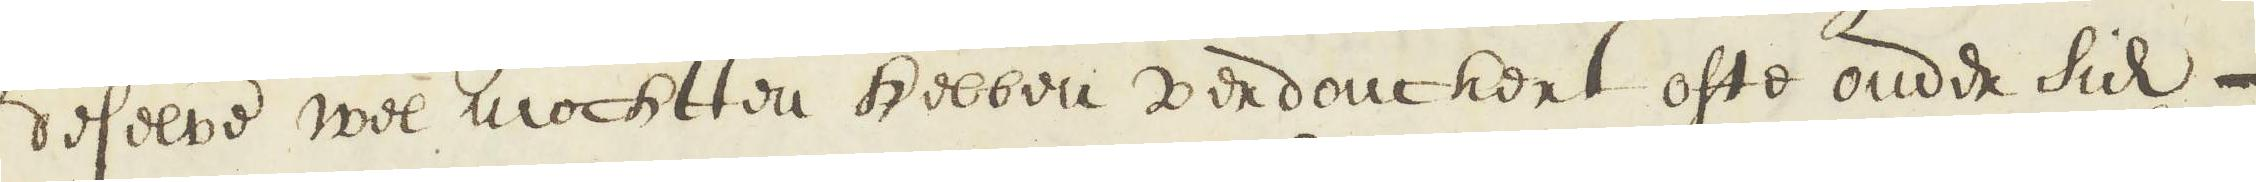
deselve wel mochtten hebben verdonckert ofte onder sich -
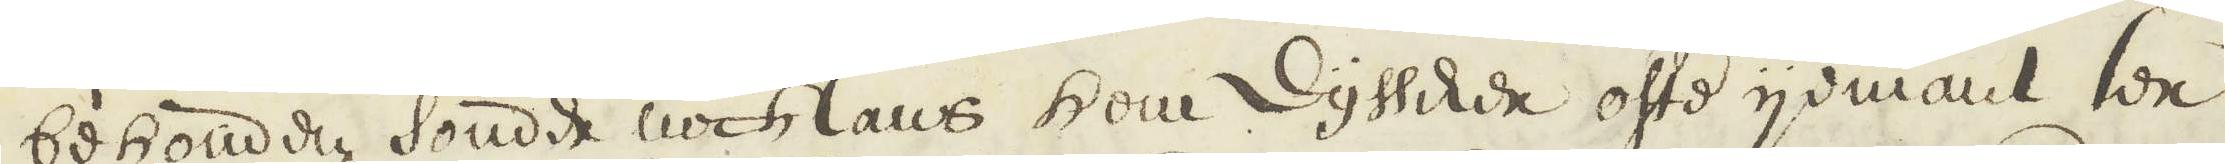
behouden sonder nochtans hem Eijsscher ofte ijemant ter
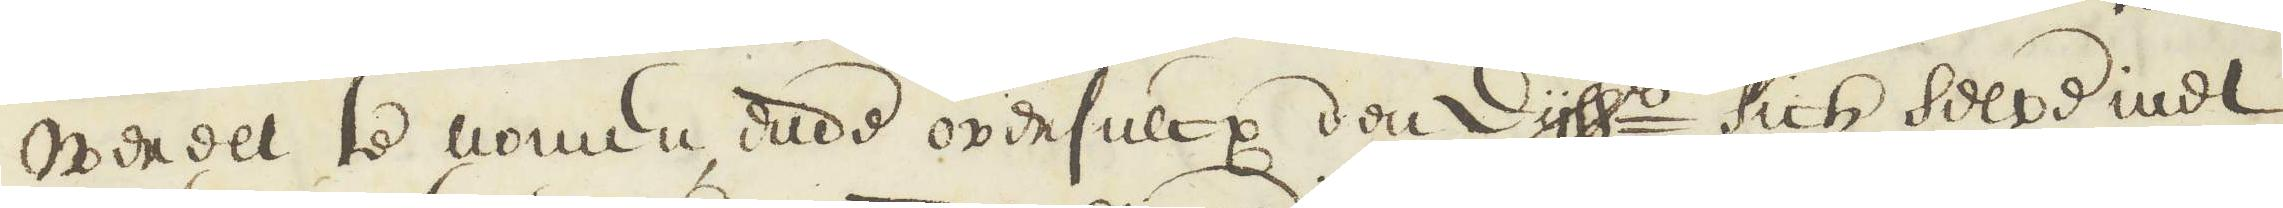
werelt te komen ende oversulcx den Eijss=r sich selve niet
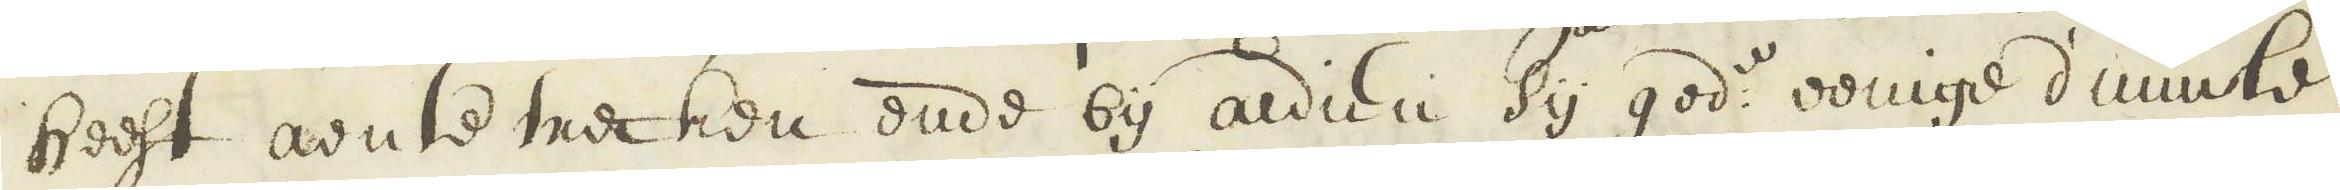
heeft aen te trecken ende bij aldien sij ged:e eenige d'minste
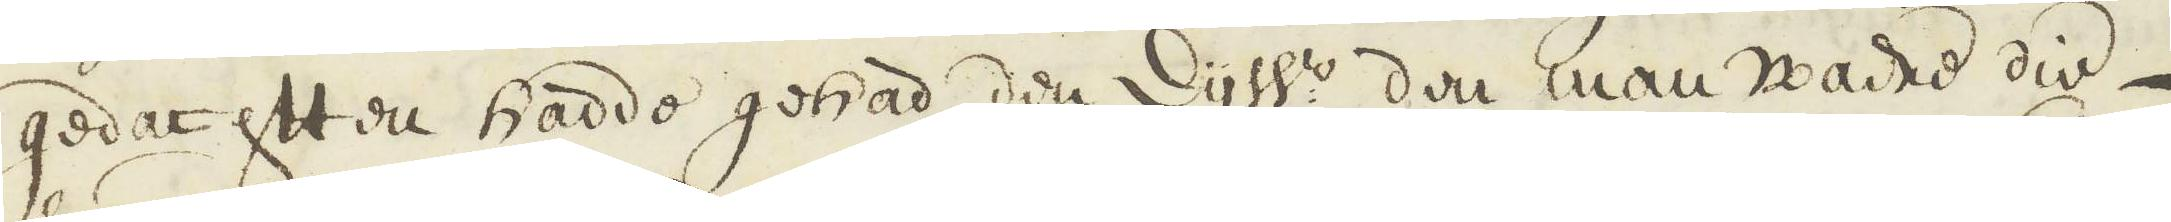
gedachten hadde gehad den Eijss:r den man waere die —
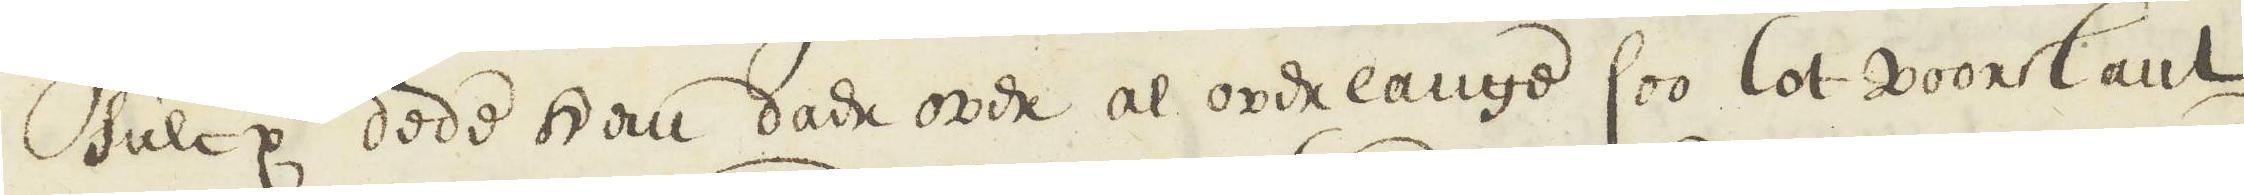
sulcx dede hem daer over al overlange soo tot voorstant
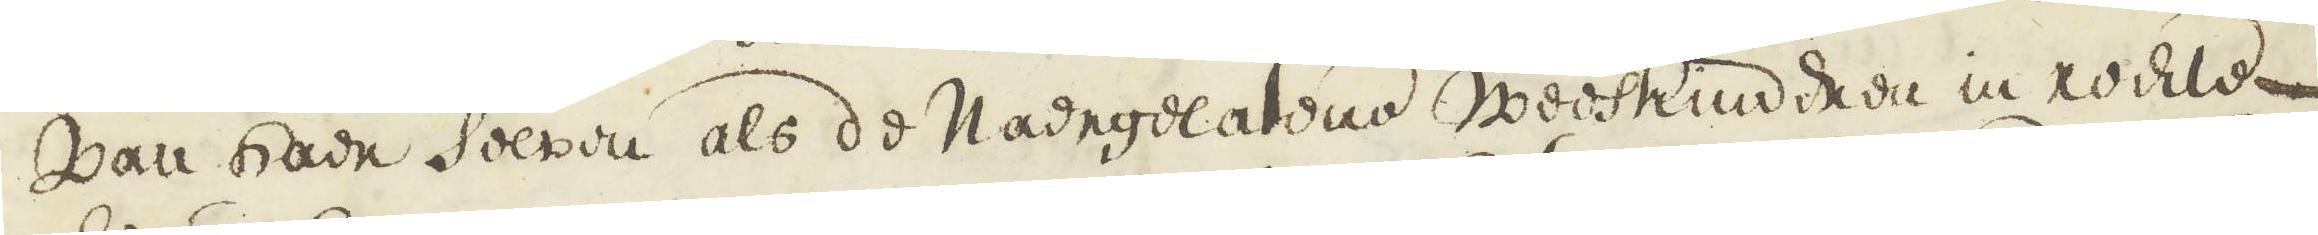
van haer selven als de Naergelatene weeskinderen in rechte—
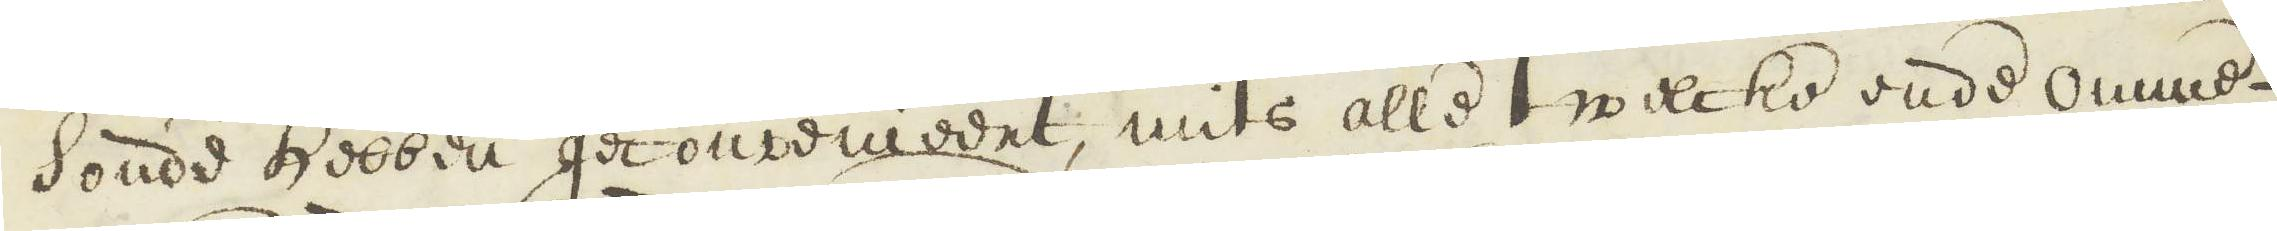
soude hebben geconvenieert; mits alle t welcke ende omme-
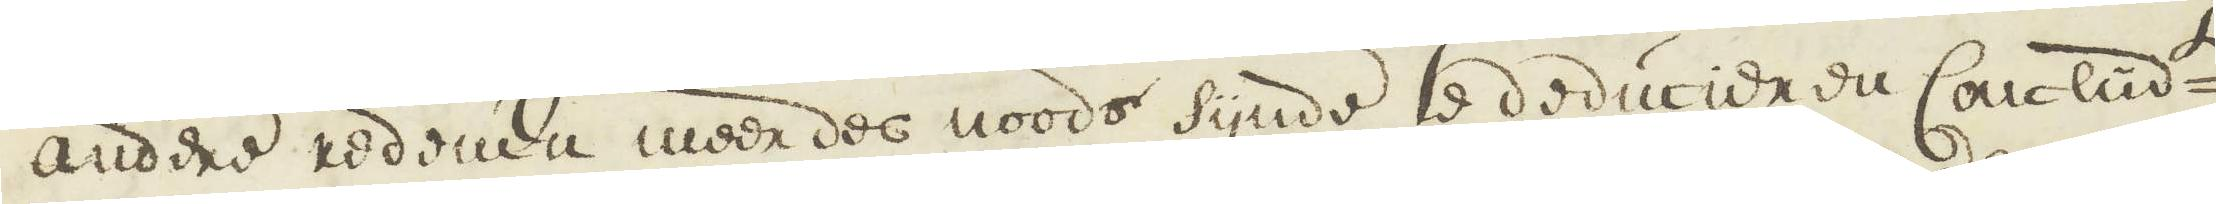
andere redenen meer des noods sijnde te deducieren Conclud=t
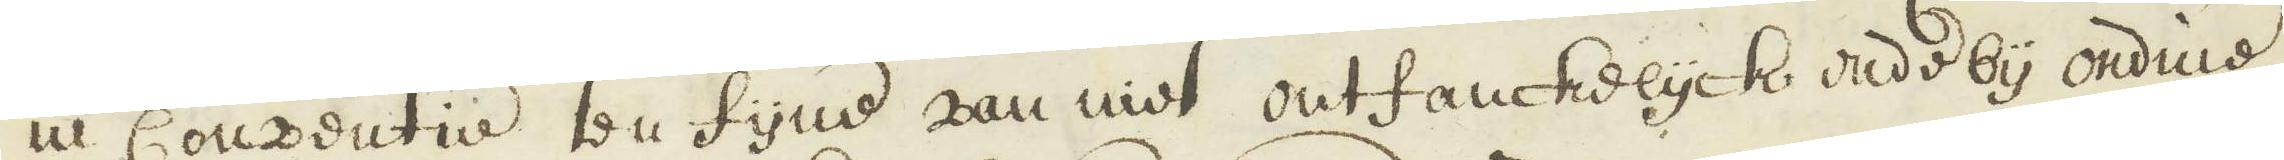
in conventie ten sijne van niet ontfanckelijck ende bij ordine
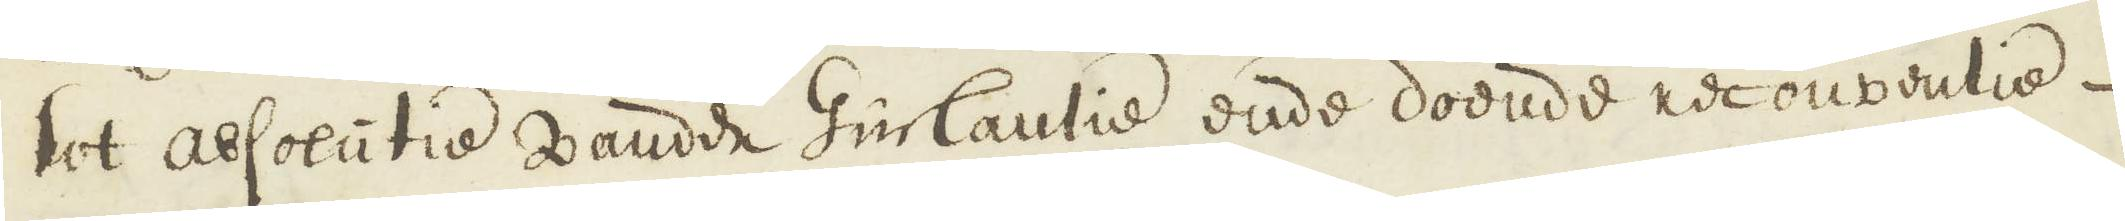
tot absolutie vander Justantie ende doende reconventie -
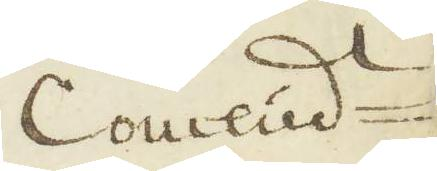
Conclud=t
